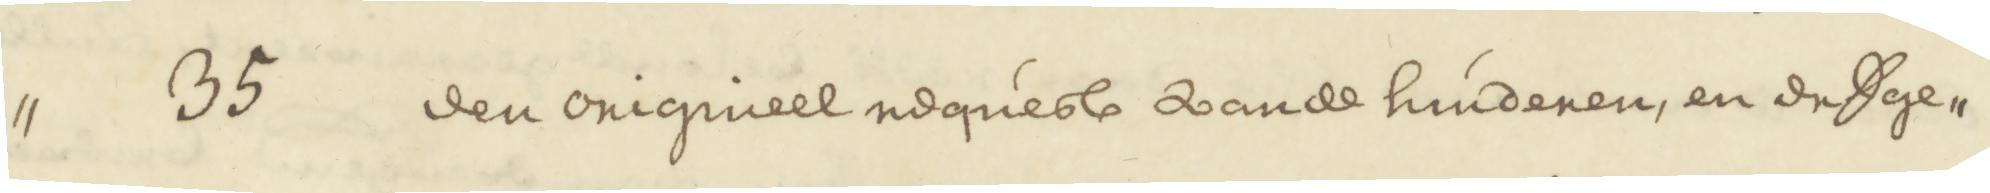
„ 35 een origineel request vande kinderen, en erfge„
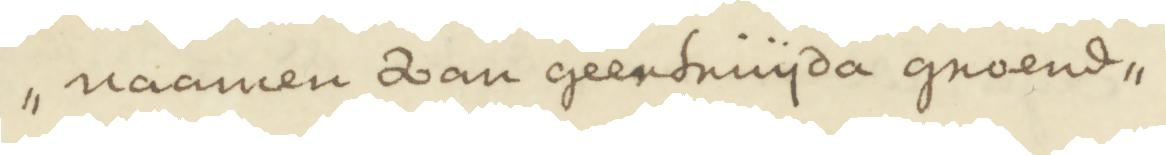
„naamen van geertruijda groene„
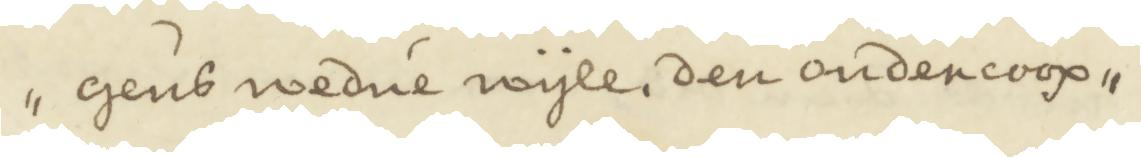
„geus wedue wijle, den ondercoop„
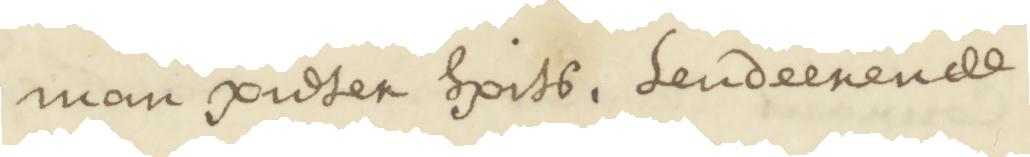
man pieter spits, tendeerende
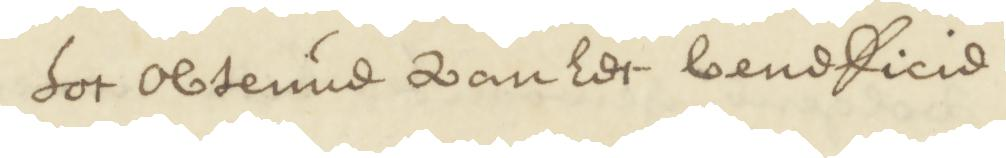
tot obtenue van het beneficie
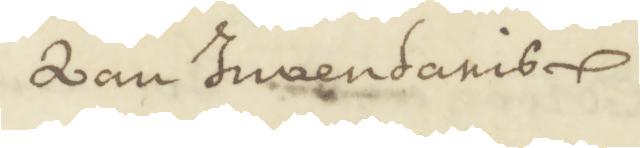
van Inventaris —
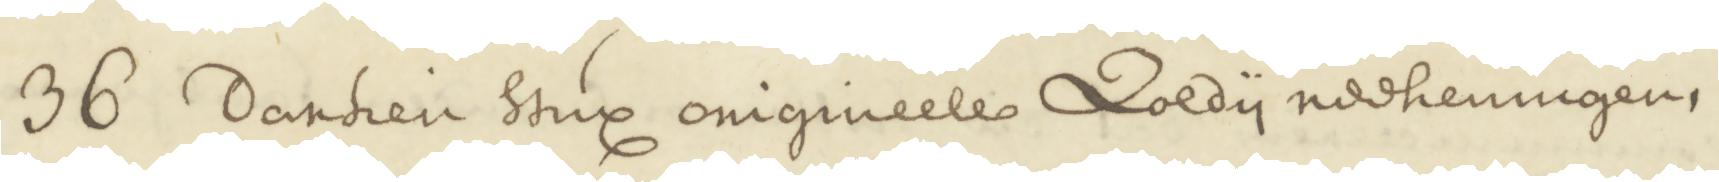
36 dartien stux origineele zoldij reekeningen,
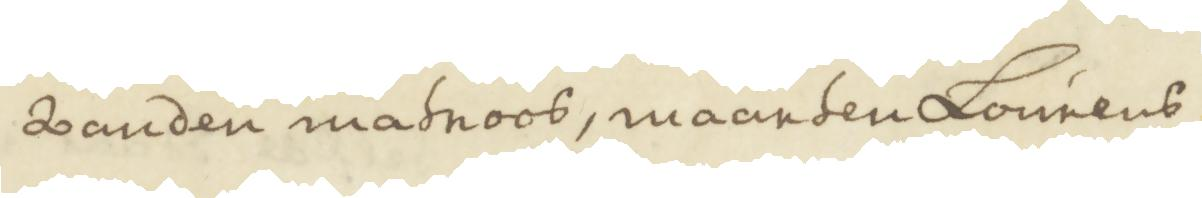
vanden matroos, maarten Lourens
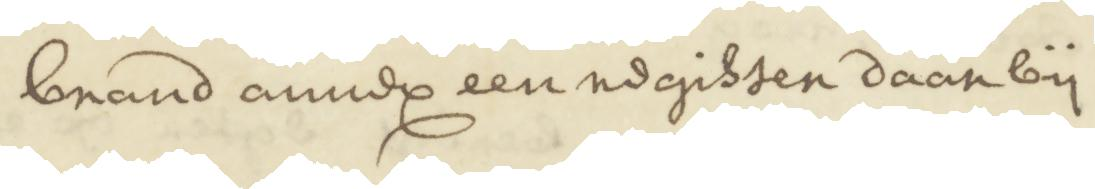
brand annex een register daar bij
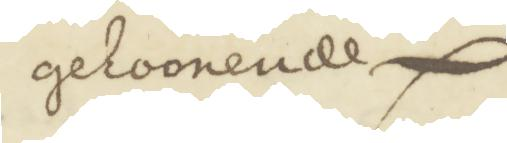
gehoorende
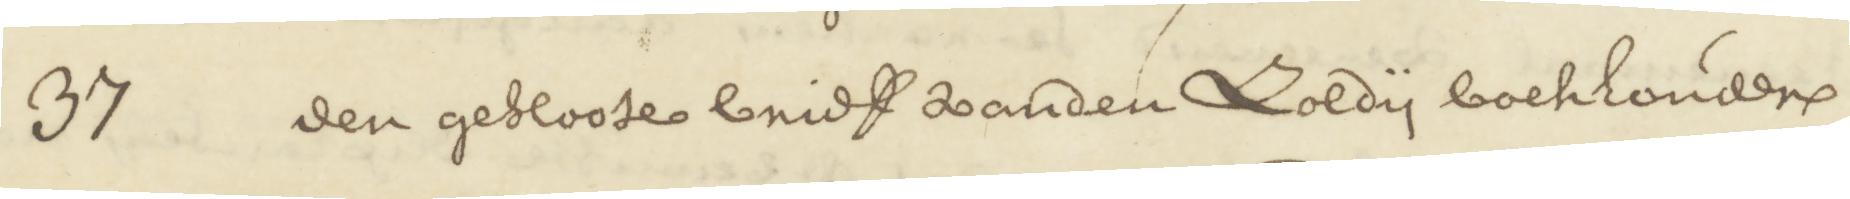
37 een gesloote brief vanden Zoldij boekhouder
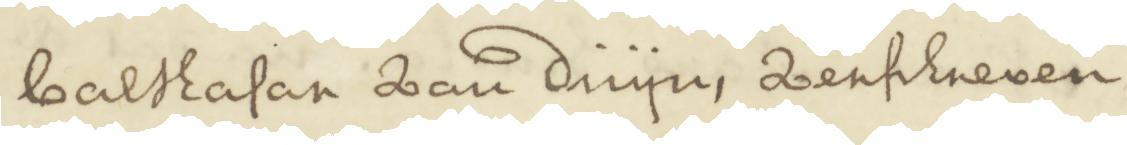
balthasar van duijn, verschreven
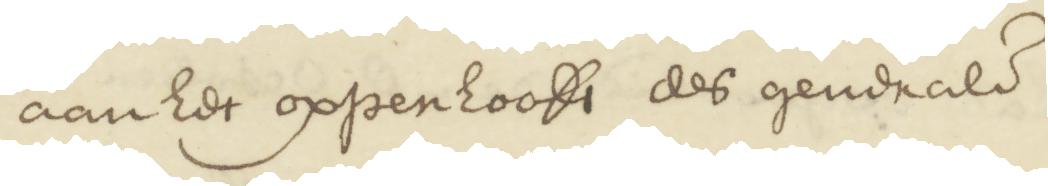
aan het opperhooft des generale
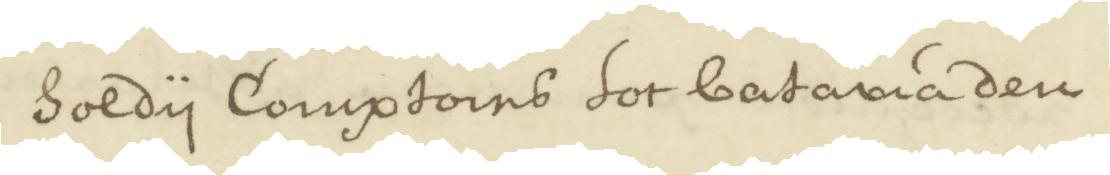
soldij Comptoirs tot batavia den
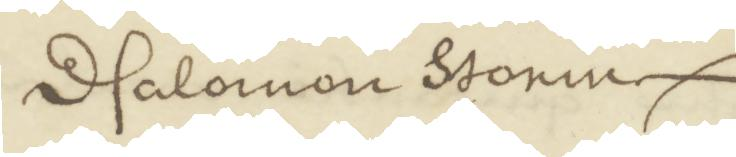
Esalomon storm —
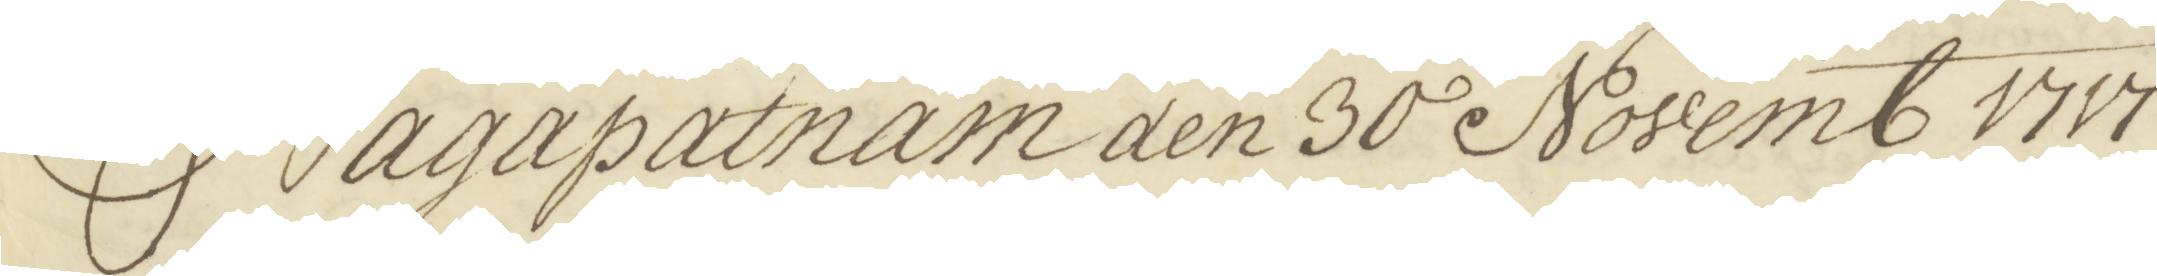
Sagapatnam den 30 Novemb 1717
